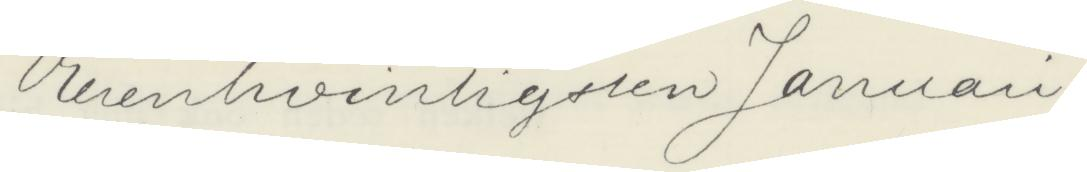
vierentwintigsten Januari
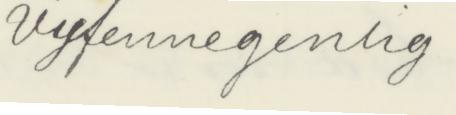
vijfennegentig
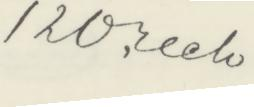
120, recto
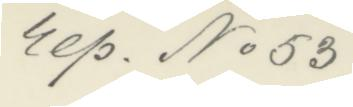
rep. No 53
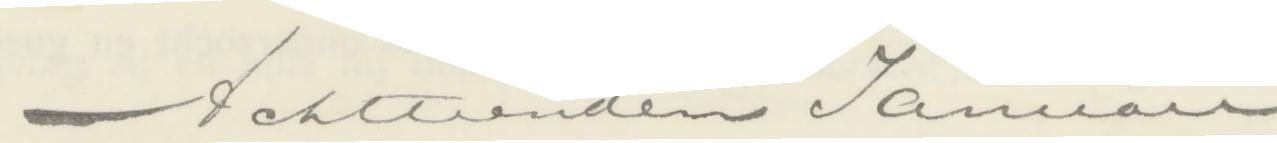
Achttienden Ianuari
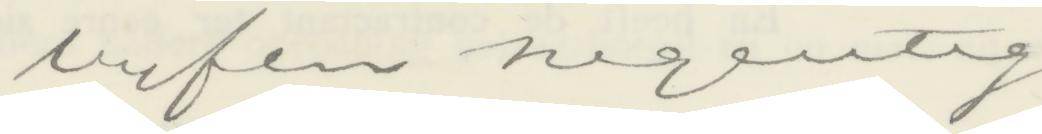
vyfen negentig
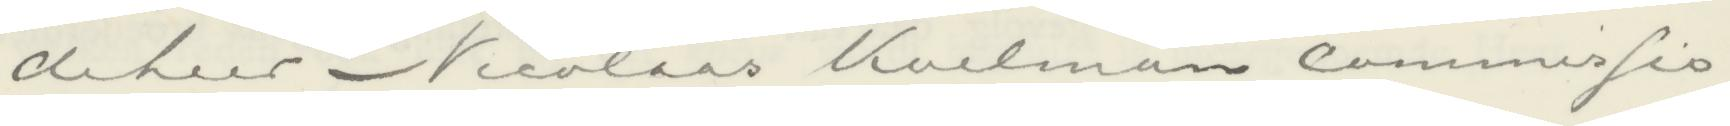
de heer Nicolaas Koelman, commissio
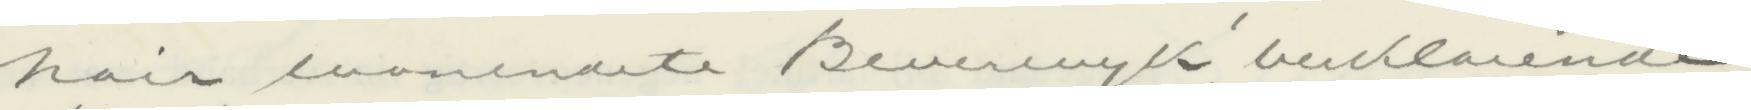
nair, wonende te Beverwyk, verklarende
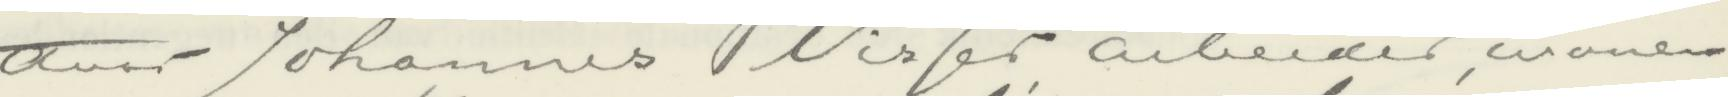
door Johannes Visser, arbeider, wonen
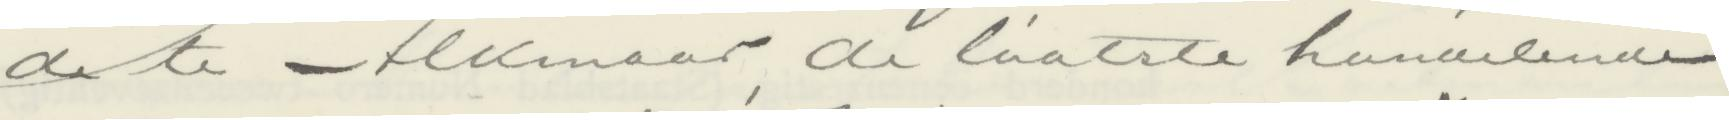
de te Alkmaar, de laatste handelende
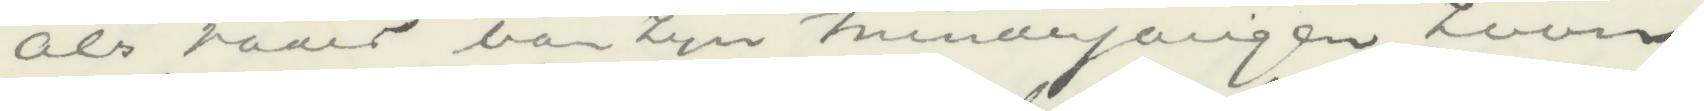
als vader van zyn minderjarigen zoon
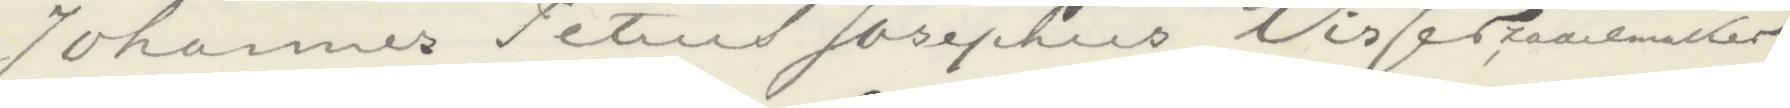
Johannes Petrus Josephus Visser, zadelmaker
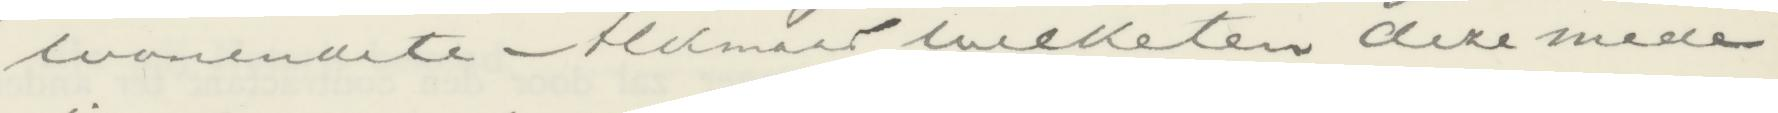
wonende te Alkmaar, welke ten deze mede
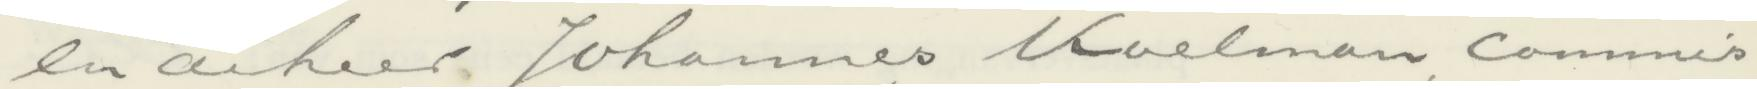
En de heer Johannes Koelman, Commis
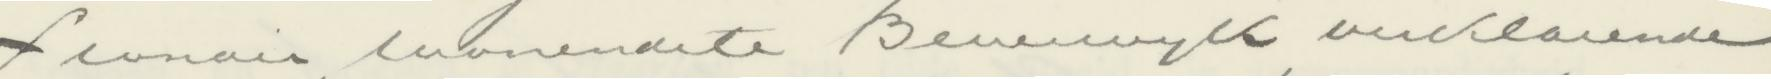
sionair, wonende te Beverwyk, verklarende
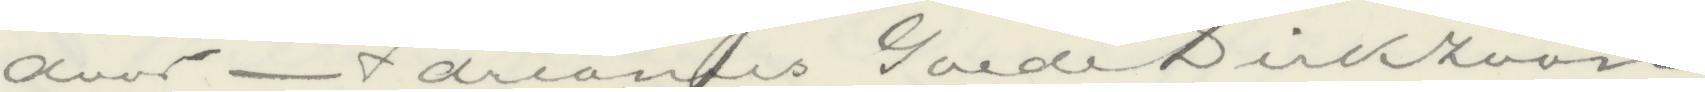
door Adrianus Goede Dirkzoon,
